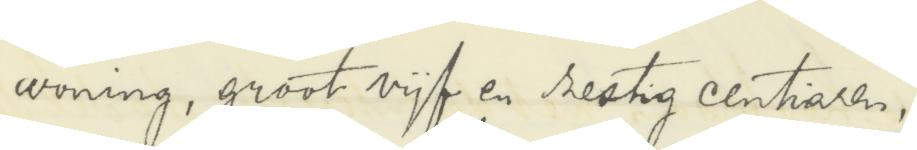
woning, groot vijf en zestig centiaren,
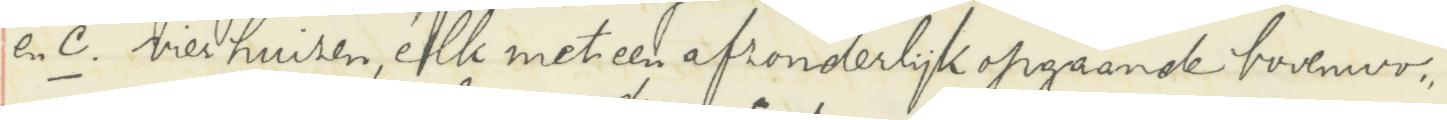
en C vier huizen, elk met een afzonderlijk opgaande bovenwo„
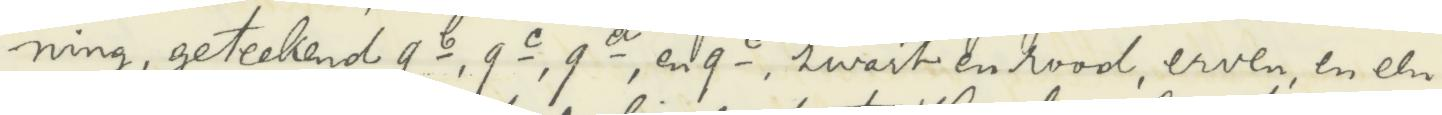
ning, geteekend 49-b, 9-c, 9-d, en 9-e, zwart en rood, erven, en een
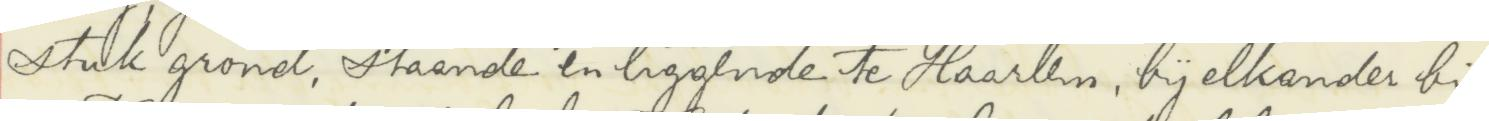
stuk grond, staande en liggende te Haarlem, bij elkander bij
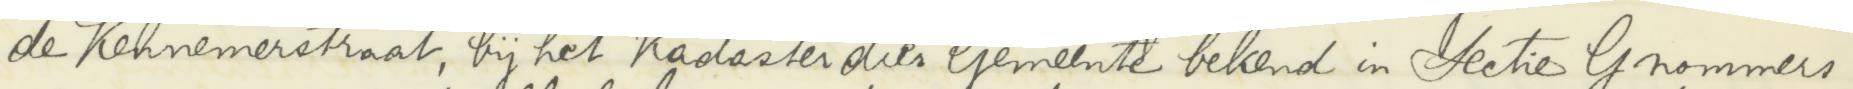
de Kennemerstraat, bij het Kadaster dier Gemeente bekend in Sectie G nommers
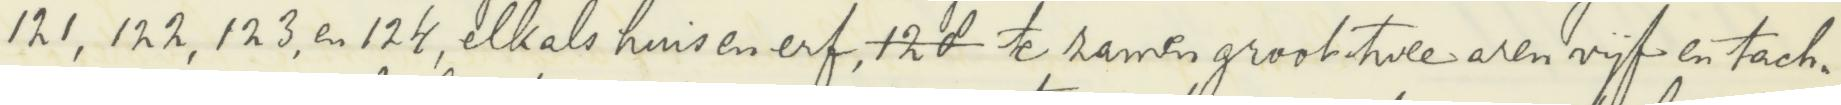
121, 122, 123, en 124, elk als huis en erf, 128 te zamen groot twee aren vijf en tach„
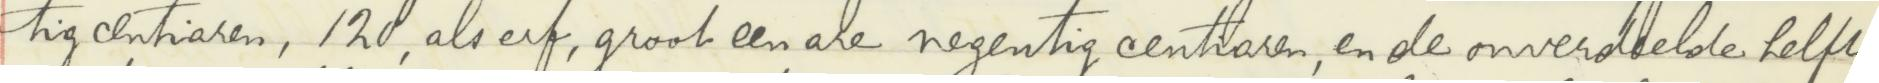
tigcentiaren, 128, als erf, groot een are negentig centiaren, en de onverdeelde helft
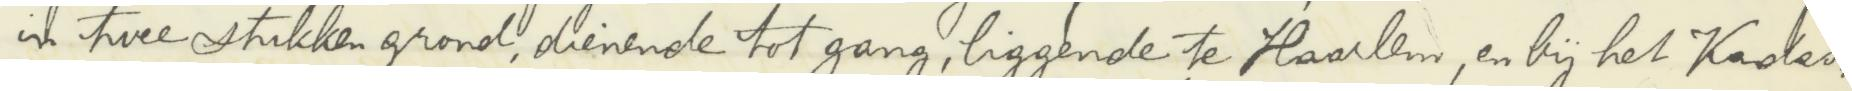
in twee stukken grond, dienende tot gang, liggende te Haarlem, en bij het Kadas
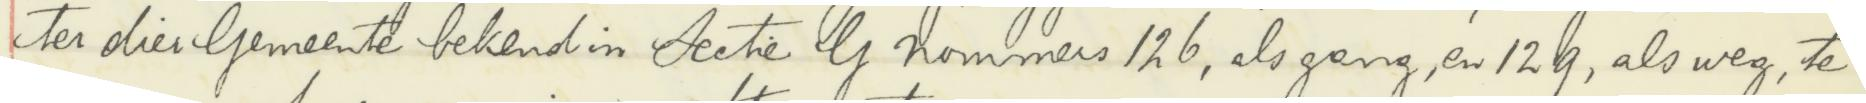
ter dier Gemeente bekend in Sectie G Nommers 126, als gang, en 129, als weg, te
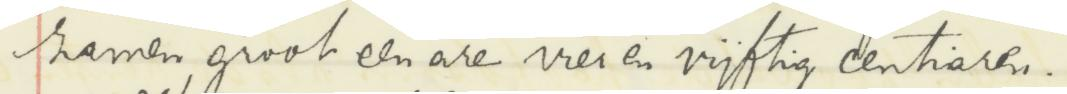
zamen groot een are vier en vijftig centiaren.
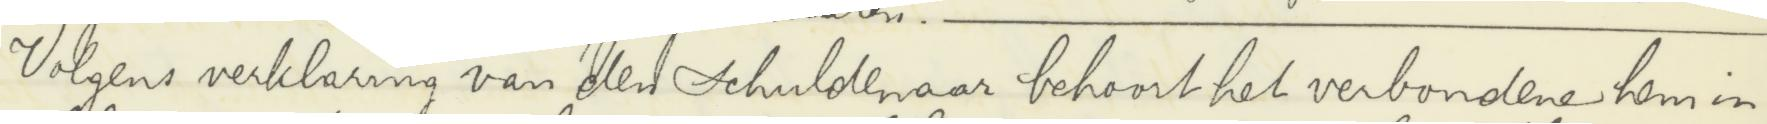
Volgens verklaring van den schuldenaar behoort het verbondene hem in
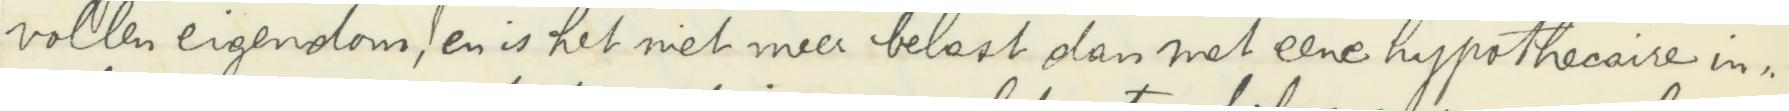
vollen eigendom, en is het niet meer belast dan met eene hypothecaire in„
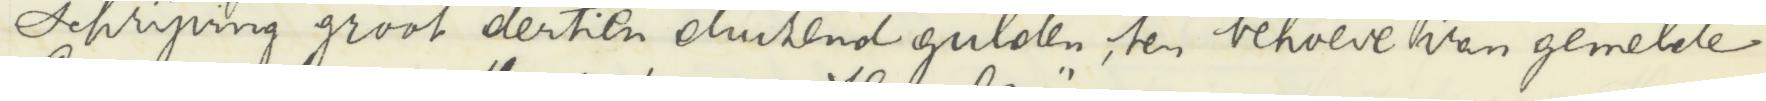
schrijving groot dertien duizend gulden, ten behoeve van gemelde
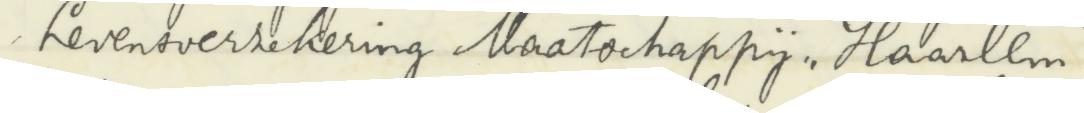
Levensverzekering Maatschappij „Haarlem"
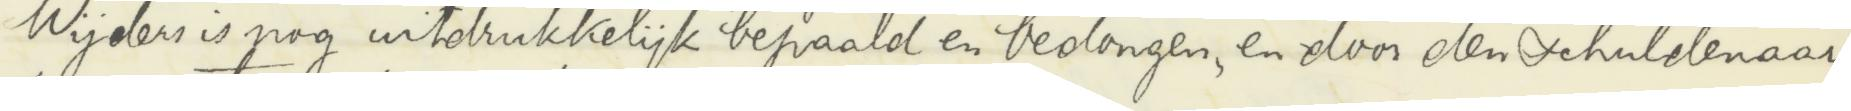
Wijders is nog uitdrukkelijk bepaald en bedongen, en door den schuldenaar
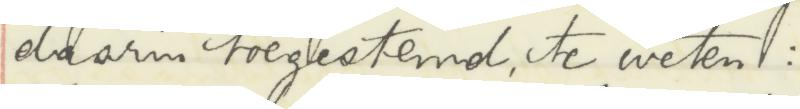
daarin toegestemd, te weten :
